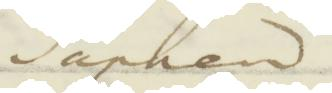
Saphen
